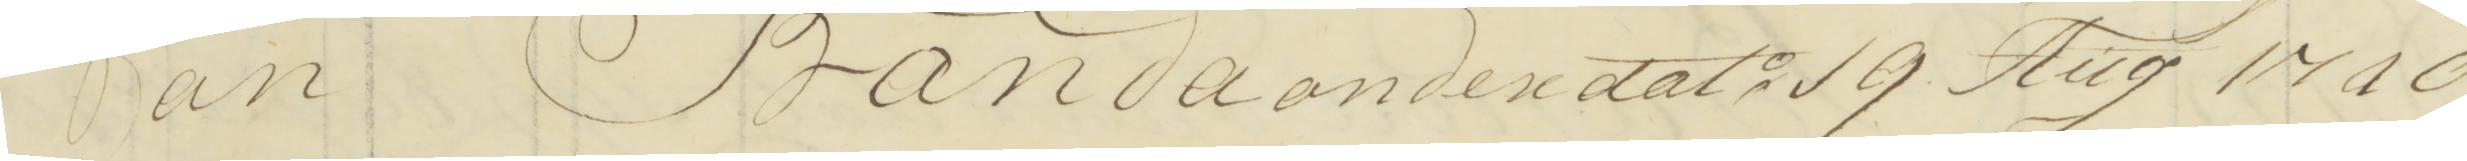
Van Banda onder dat„o 19. Aug 1740
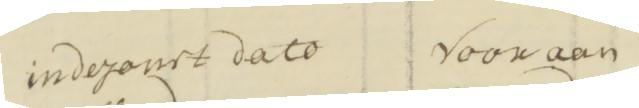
in dejourt dato voor aan
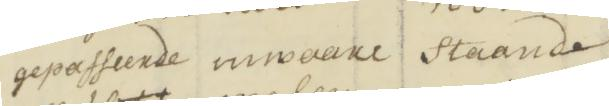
gepasseerde inwaare staande
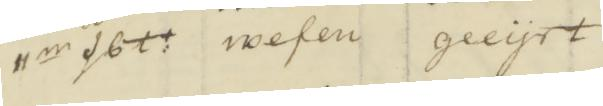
11-m pt:t wesen geeijst
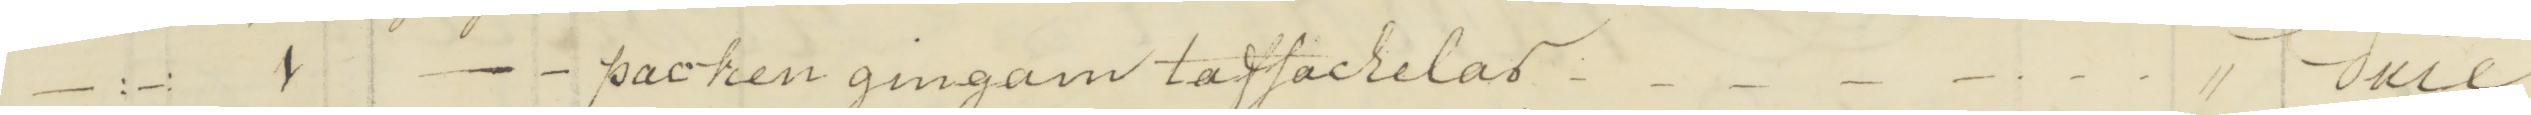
— :-: 1 — - packen gingam taffachelas - - - - - - - „ drie
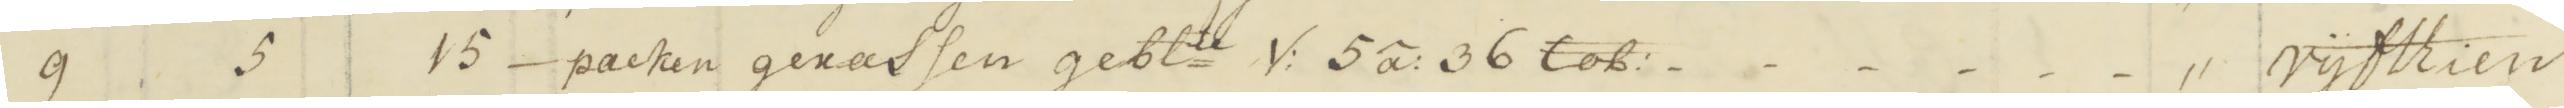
9 5 15 — packen gerassen gebl=te V: 5 â: 36 cob: - - - - - - „ vijfthien
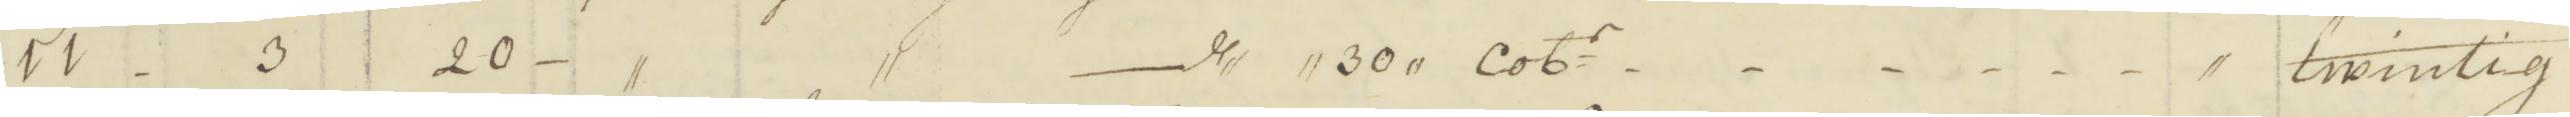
11 - 3 20 - „ „ _„o „30„ cob=s - - - - - - „ twintig
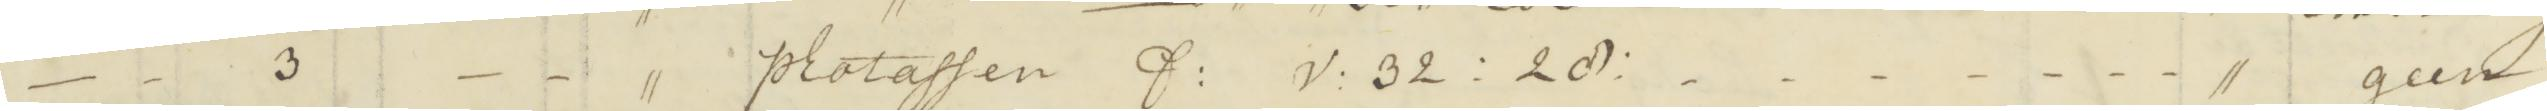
— - 3 — - „ photassen cf: v: 32 : 28: - - - - - - - „ geen
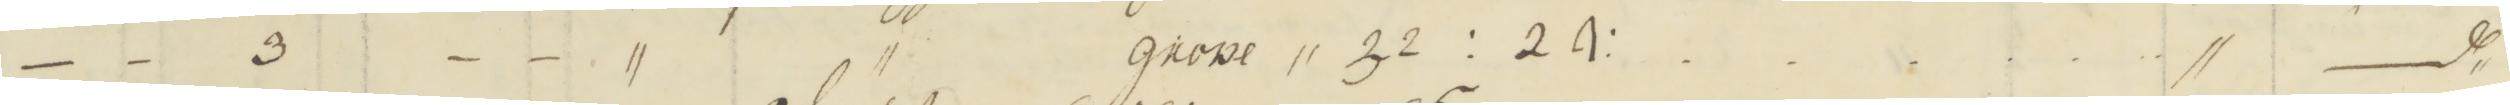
— - 3 — - „ „ grove „ 32 : 24: - - - - - - „ _„o
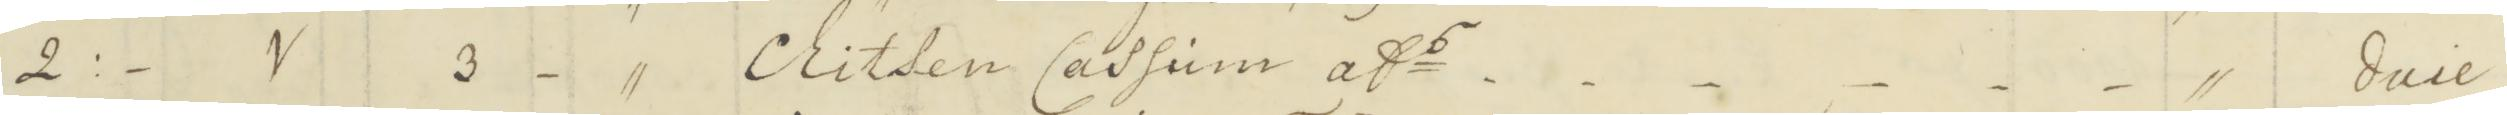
2 : - 1 3 - „ Chitsen cassum af=s - - - - - - „ drie
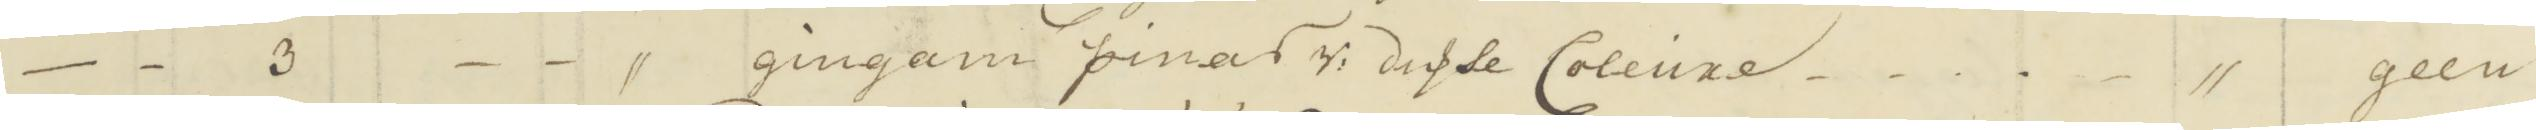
— - 3 — - „ gingam pinas v: diverse coleure - - - - - „ geen
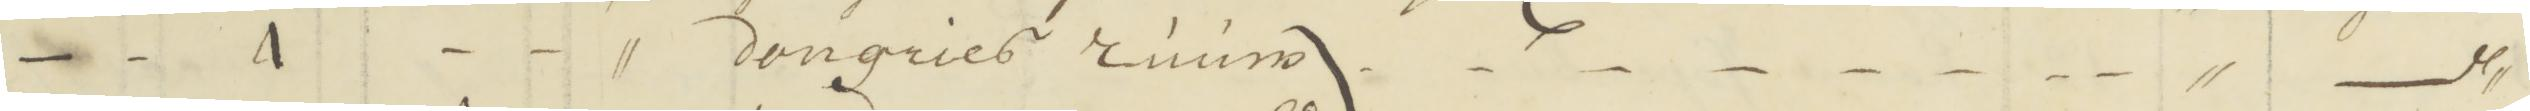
— - 4 — - „ dongries ruuw - - - - - - - - „ _„o
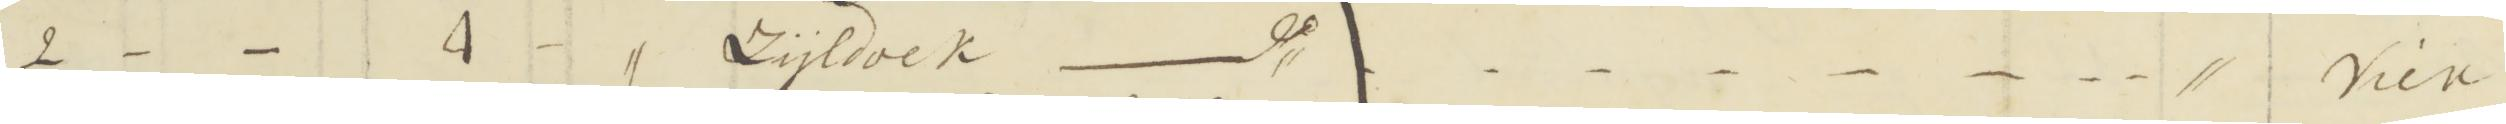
2 - — 4 - „ Zijldoek _„o - - - - - - - - „ vier
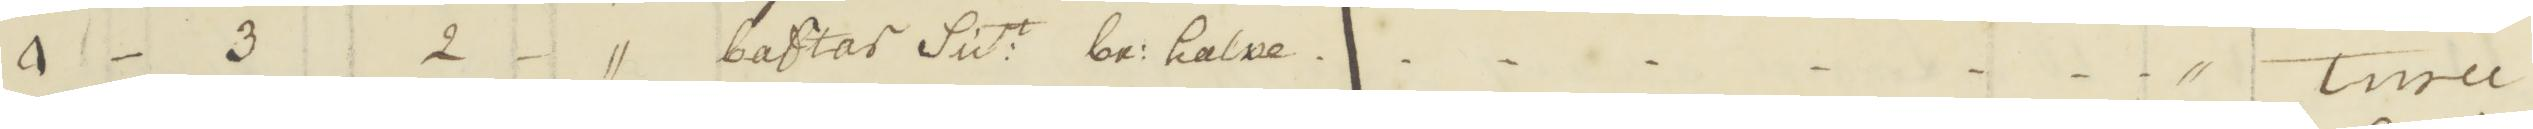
4 - 3 2 - „ baftas Su:t br: halve - - - - - - - - „ twee
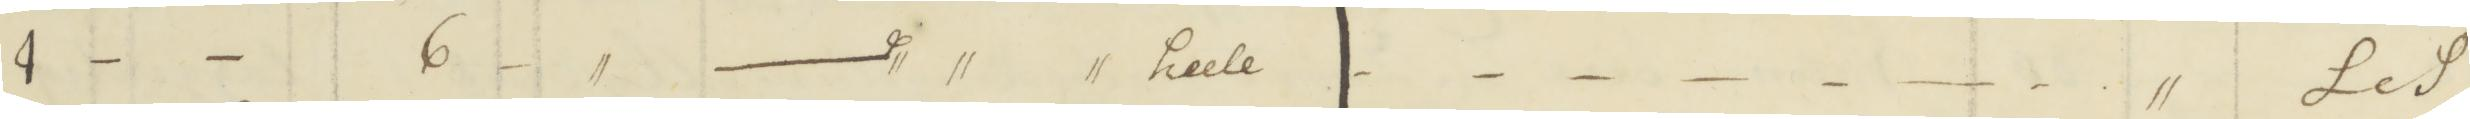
4 - — 6 - „ _„o „ „ heele - - - - - - - - „ ses
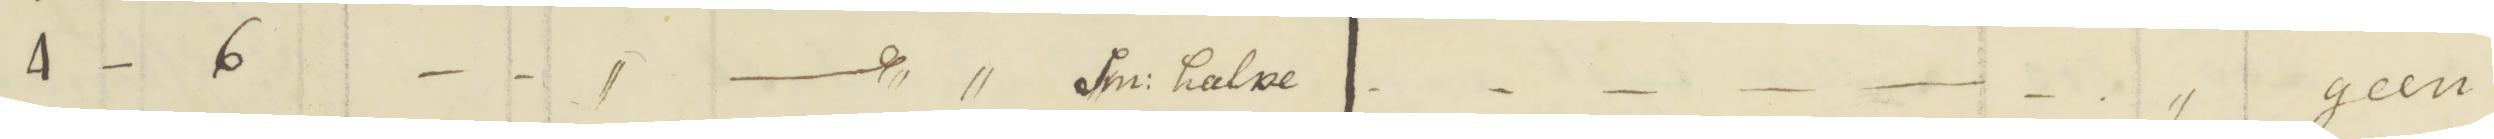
4 - 6 — - _„o „ Sm: halve - - - - - - - „ geen
